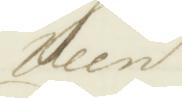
Veen
